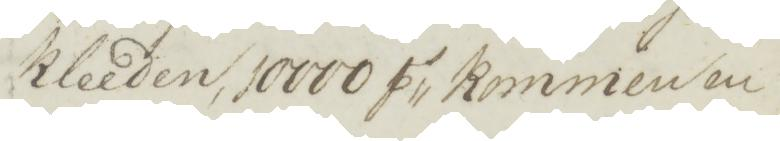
kleeden, 10000 p„s kommen en
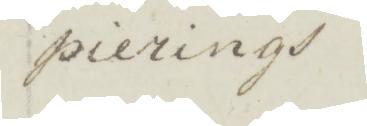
pierings
